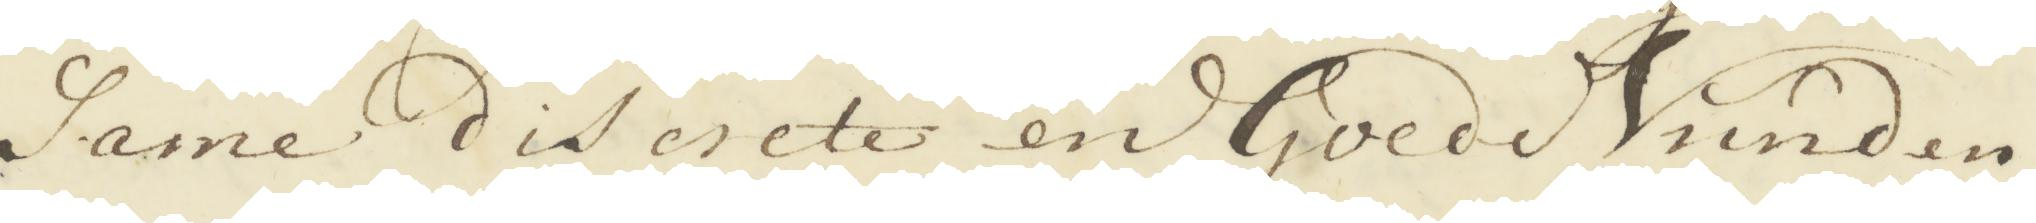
same disesete en Goede Vunden
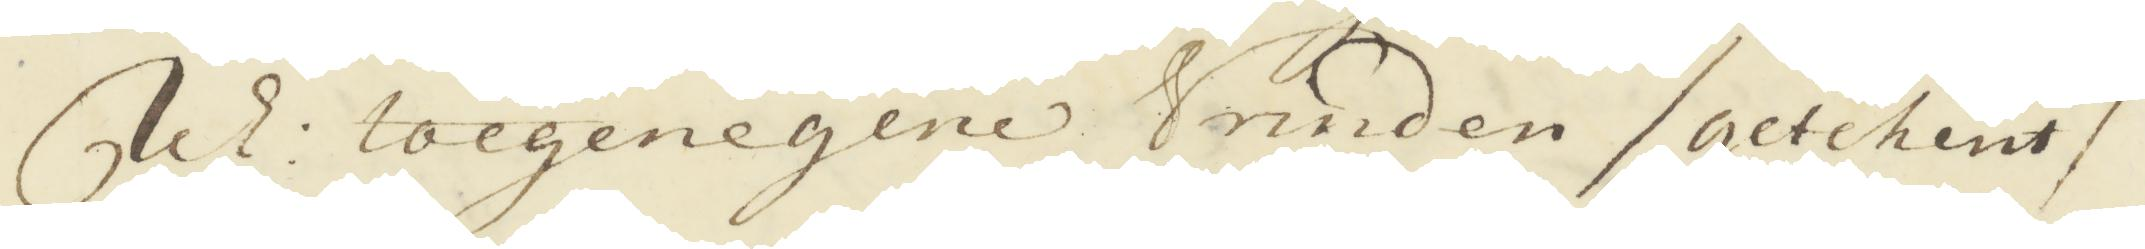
UE: toegenegene Vrunden /getekent/
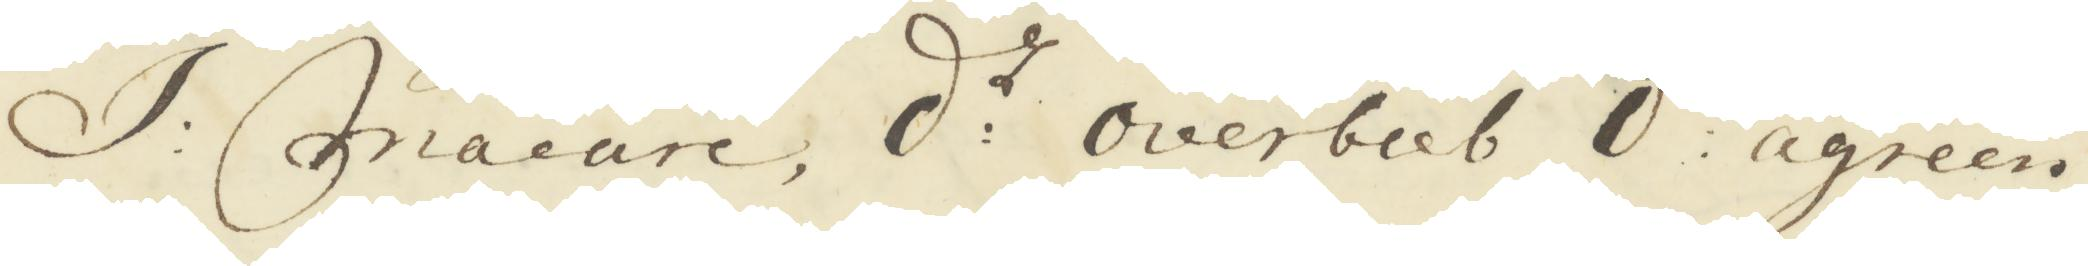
I: Macare, d:s overbieb d:s agreen
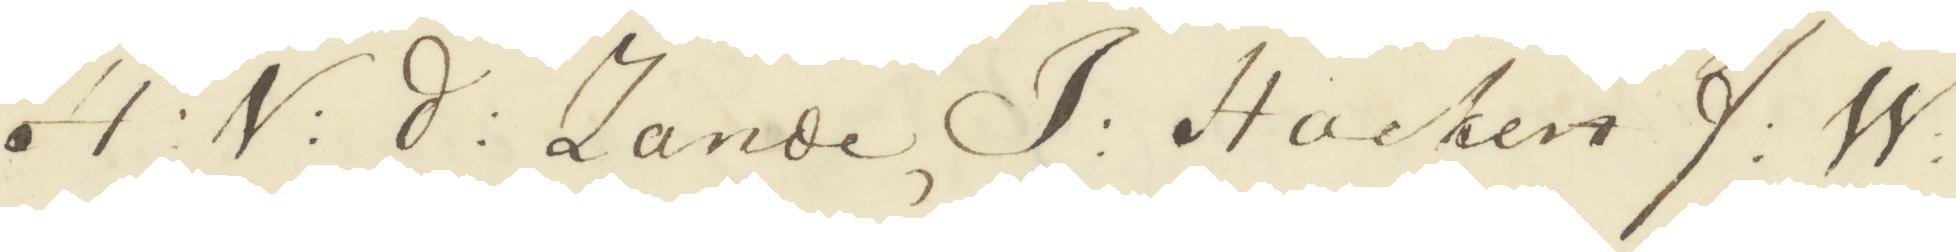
H: V: d: Zande, I: Hacken F: W:
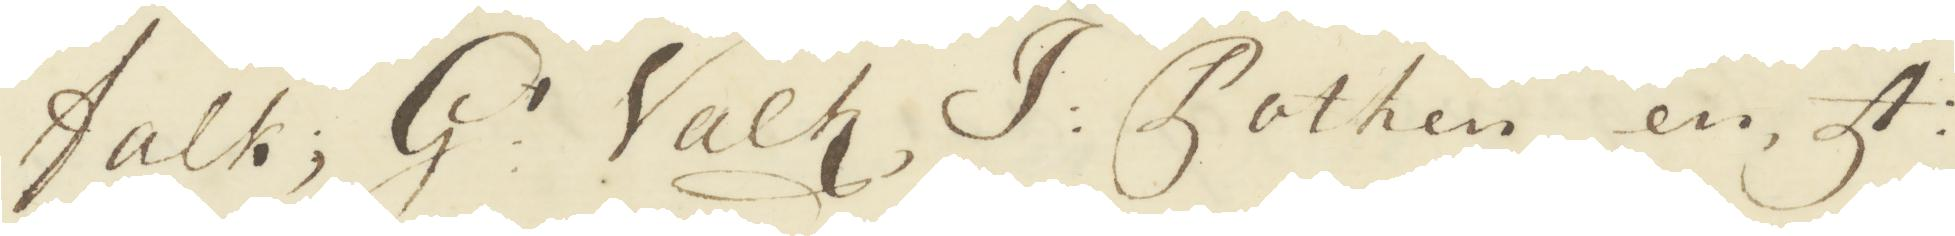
Falk; G:r Valk, I: Lothen, en A:
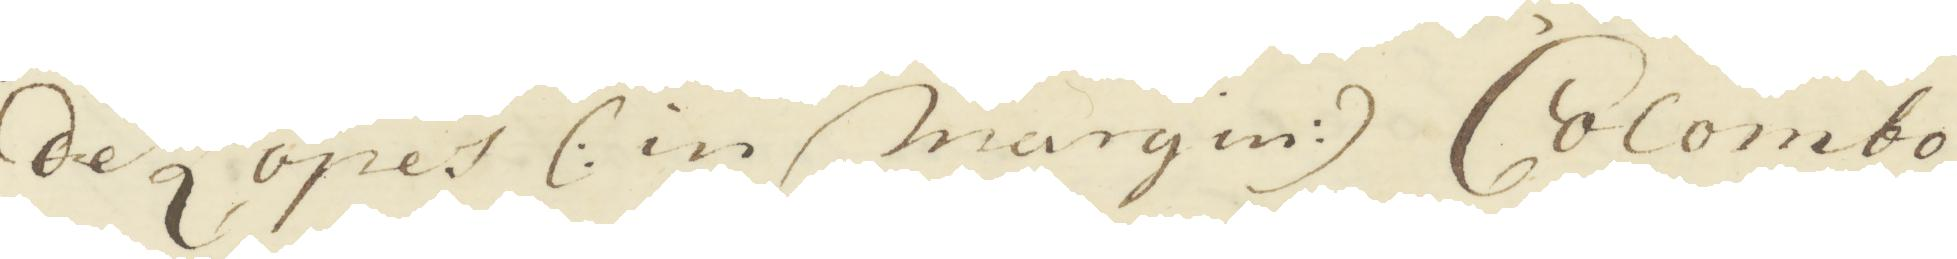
de Lopes (:in margin:) Colombo
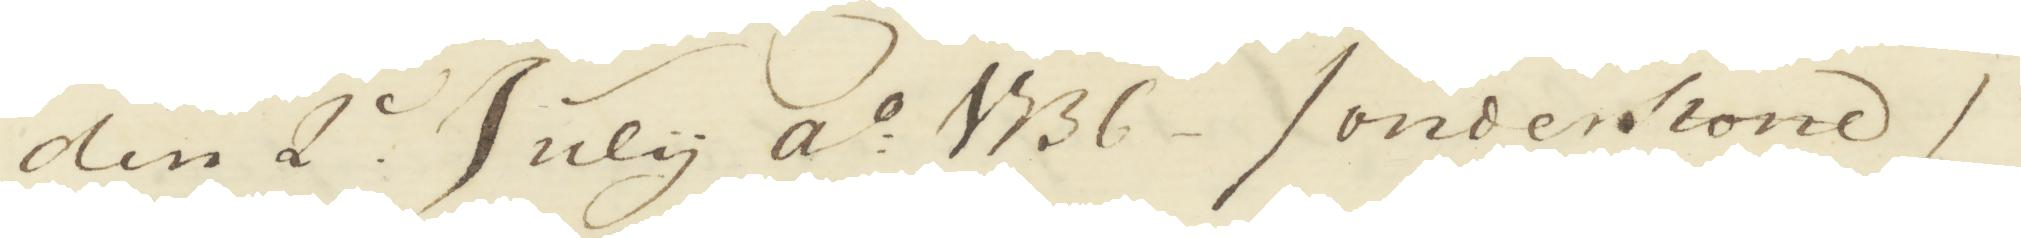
den 2.e Julij a:o 1736 - /onderstond/
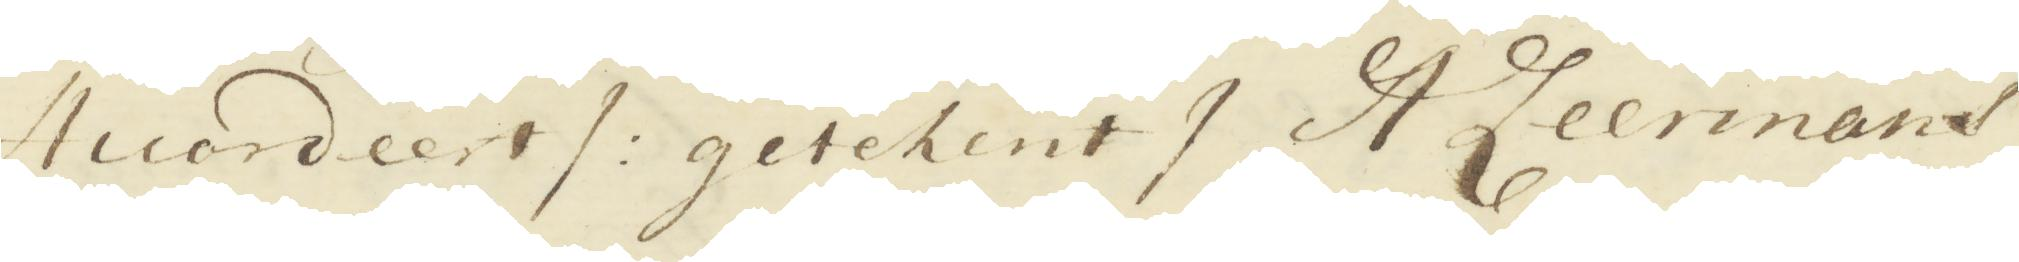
Huordeert /:getekent/ A Leermans
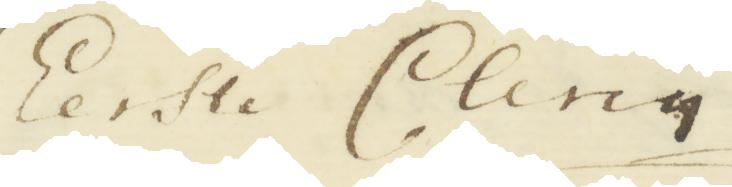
Eerste Clercq
